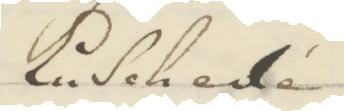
Enschedé
